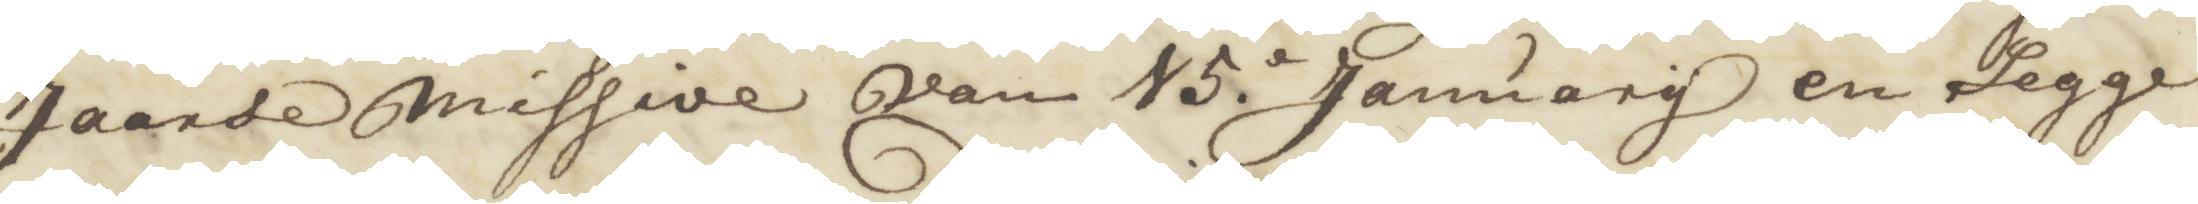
Jaarse Missive van 15.e Januarij en segge
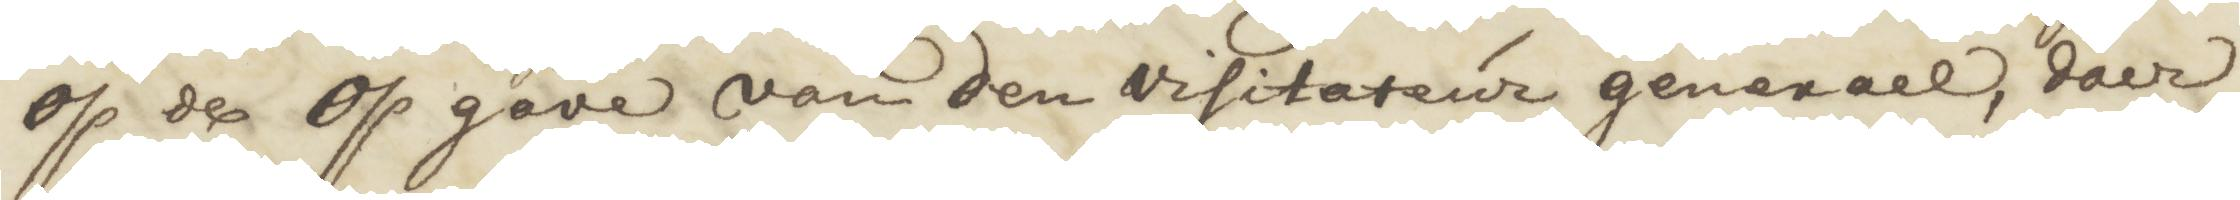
op de op gave van den visitateur generael, daer
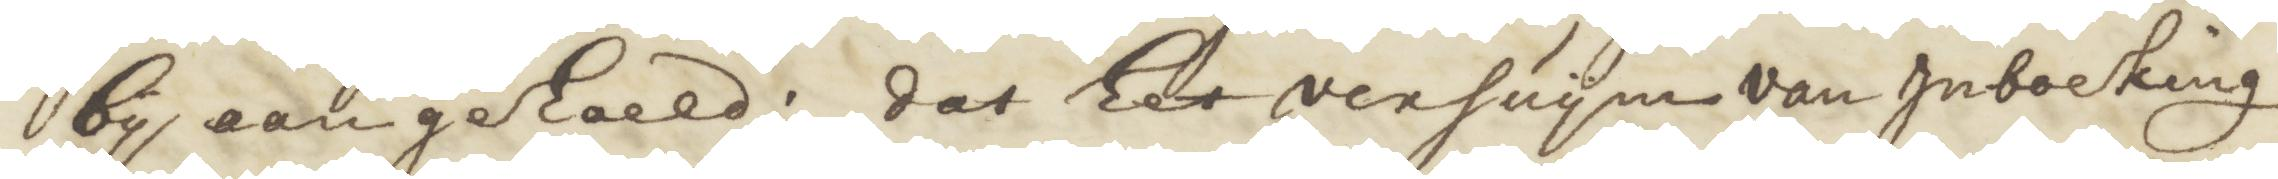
bij aan gehaeld; dat het versuijm van Jnboeking
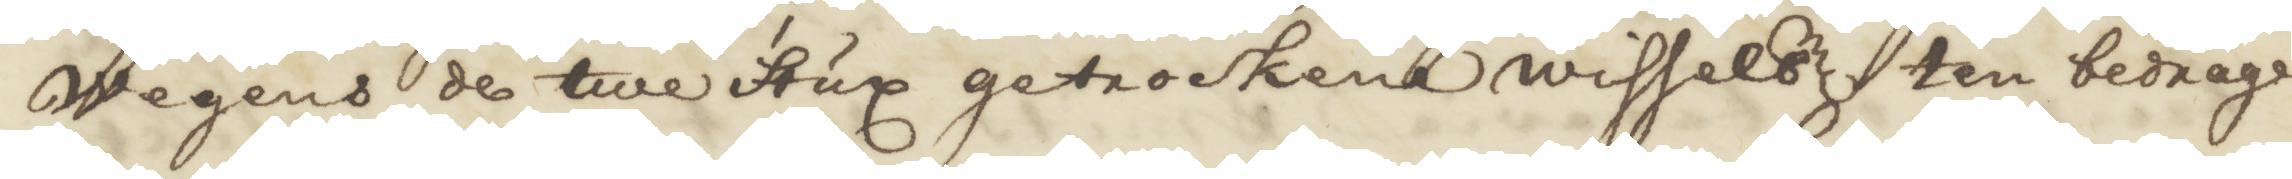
wegens de twe stux getrockene wissels ten bedrage
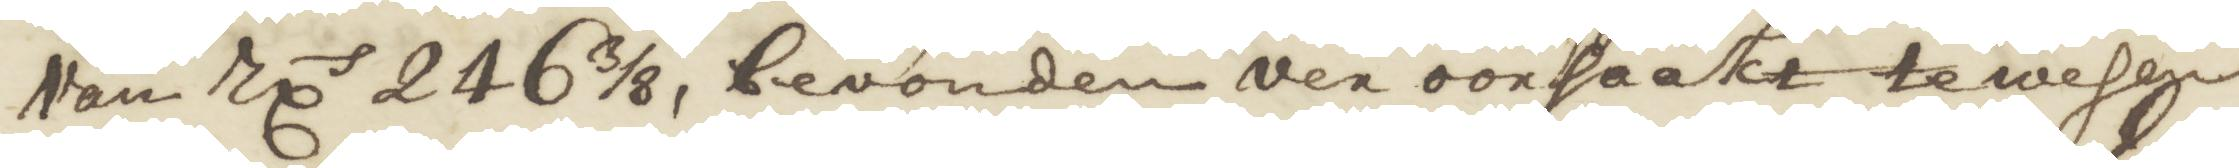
van rxs 246 3/8, bevonden veroorsaakt te wesen
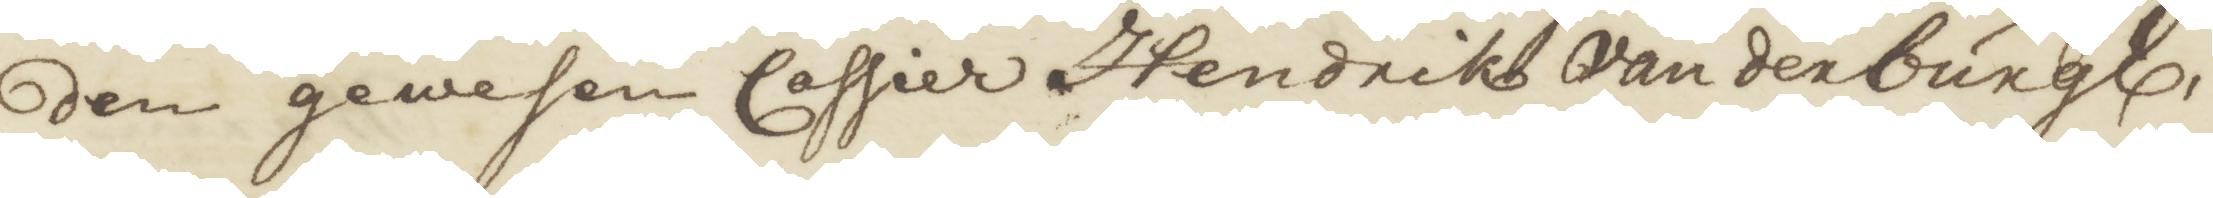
den gewesen Cassier Hendrik van der burgh,
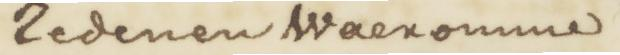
redenen waeromme
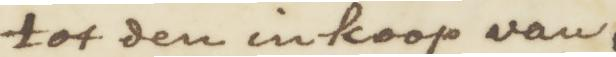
tot den inkoop van
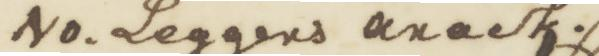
10. leggers arack.
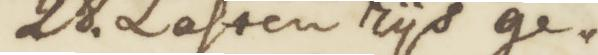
28. lasten rijs ge„
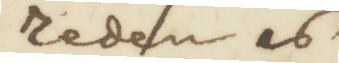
reden is
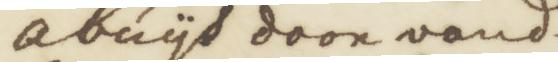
abuijs door van d=er
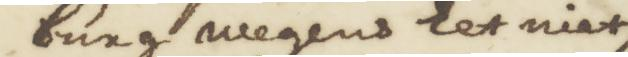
burg wegens het niet
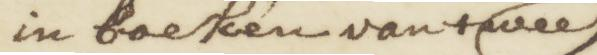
in boeken van twee
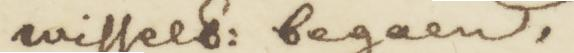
wissels: begaen,
